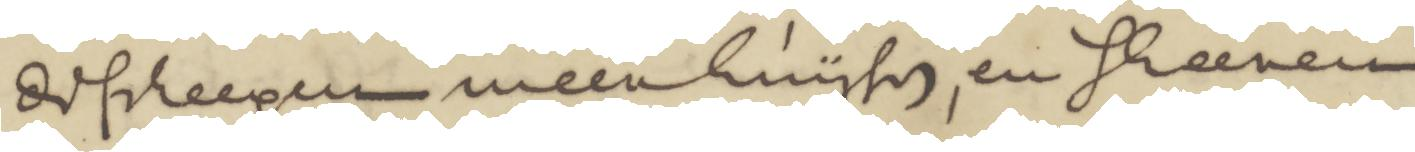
de scheepen meerhuijsen, en sheeren
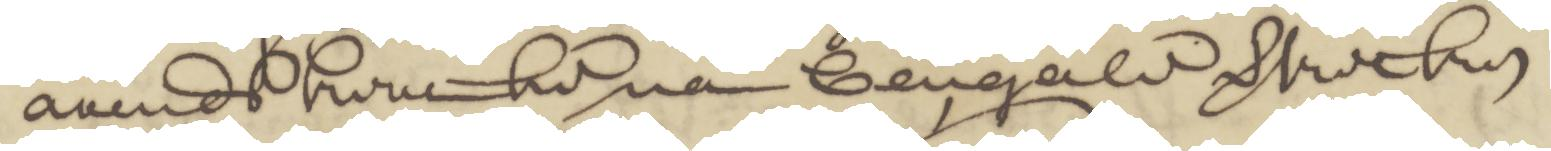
arendskercke na bengale vertrecken
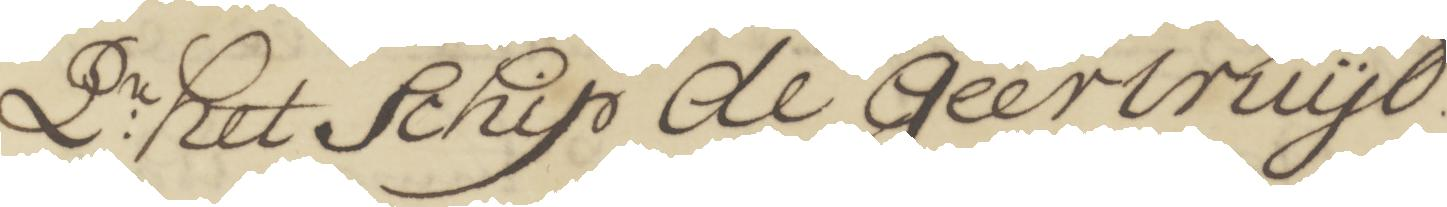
L:r Het schip de Geertruijd.
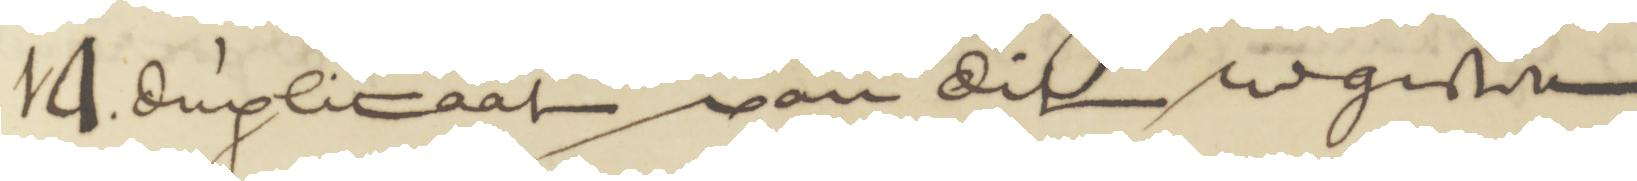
14. duplicaat van dit register
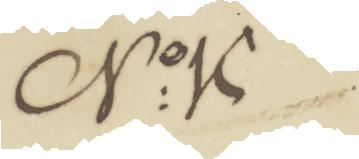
N:o 15
